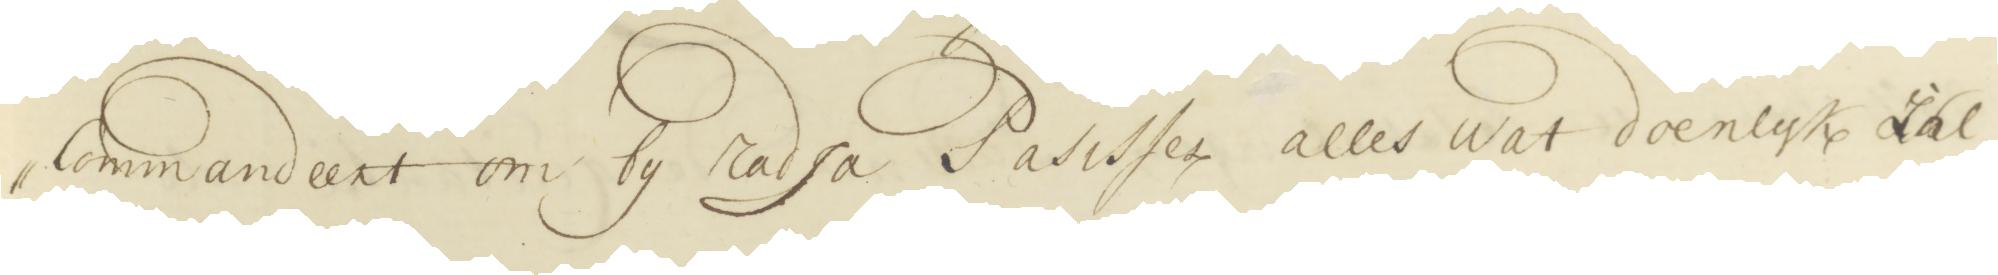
„Commandeert om by radja Pasisser alles wat doenlyk zal
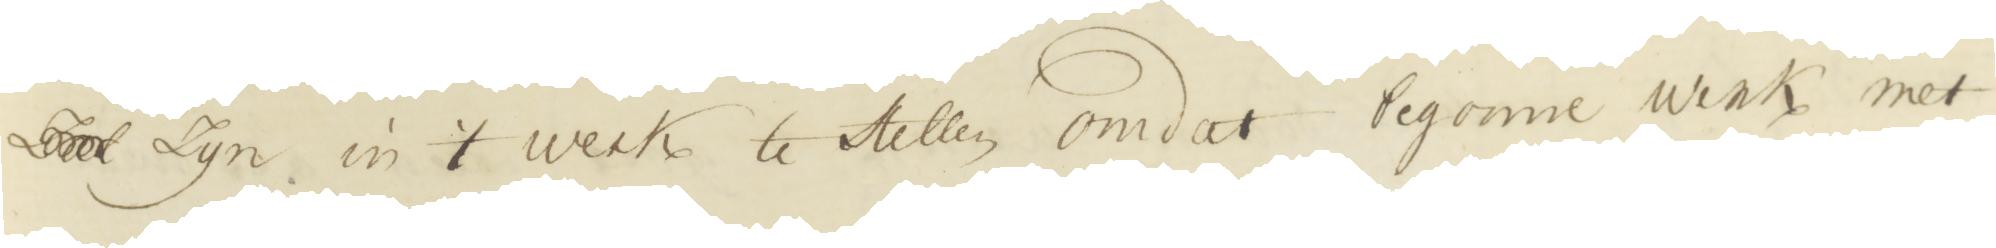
zal zyn in ’t werk te stellen omdat begonne werk met
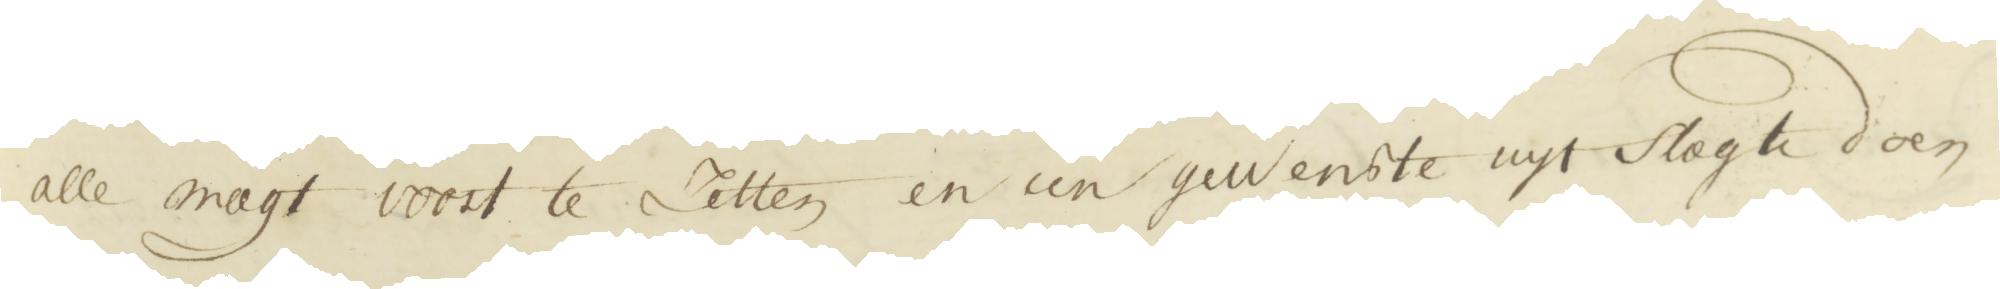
alle magt voort te Zetten en een gewenste uijtslag te doen
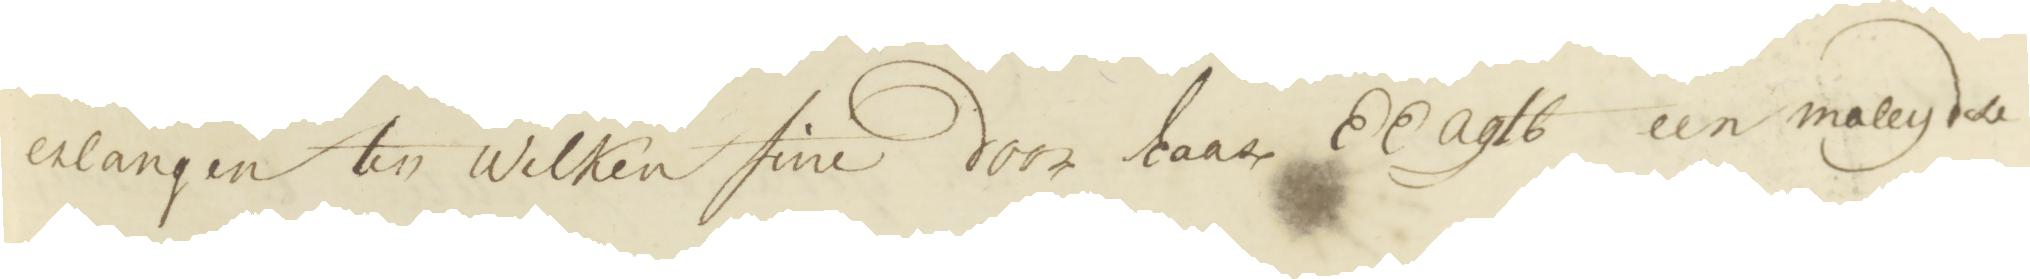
erlangen ten welken fine door haar EE agtb een maleydse
